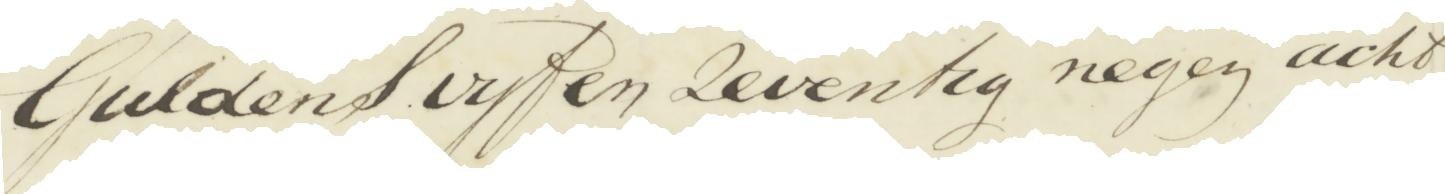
Guldens vyf en zeventig negen acht
